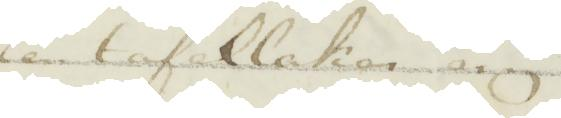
Een tafellaken enz
